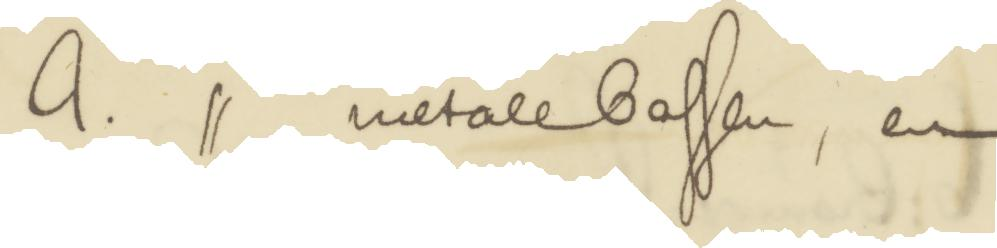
4. „ metale bassen, en
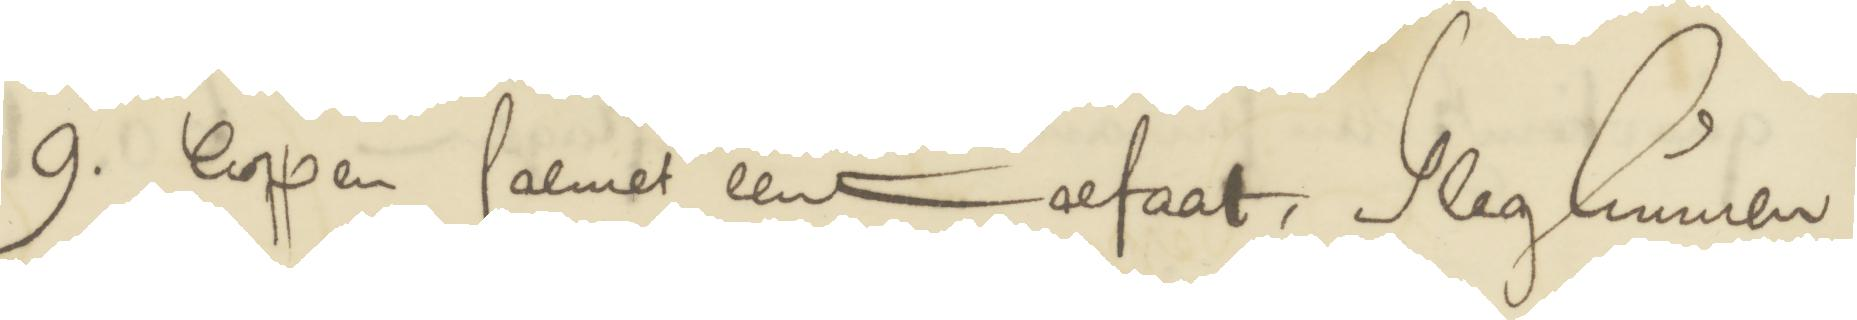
9. koppen salmet een calfaat, sleg kunnen
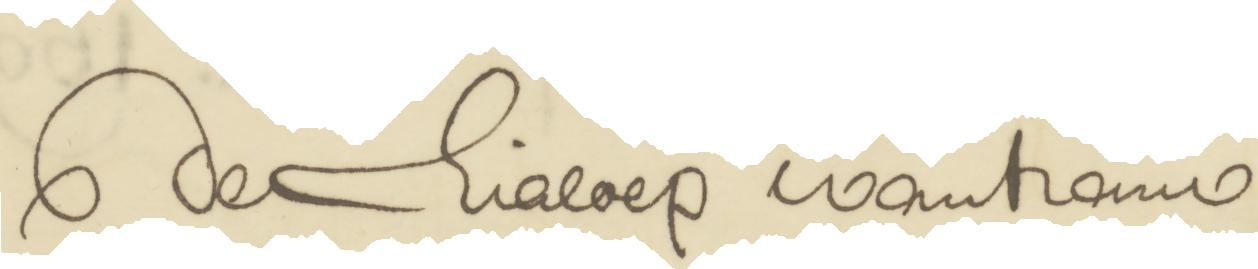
de chialoep wantrouw
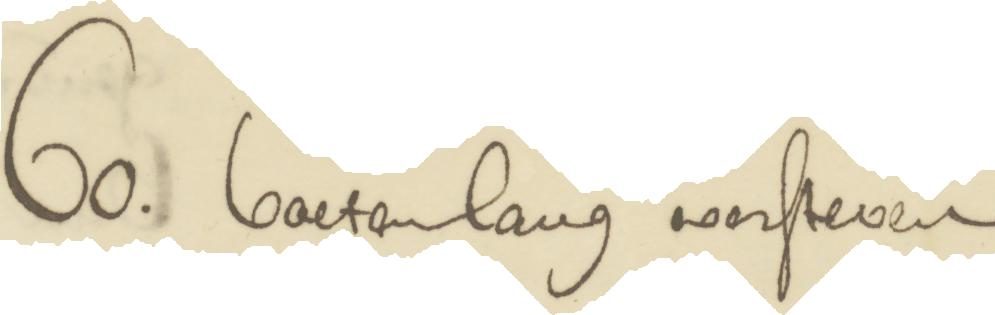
60. voeten lang vorsteven
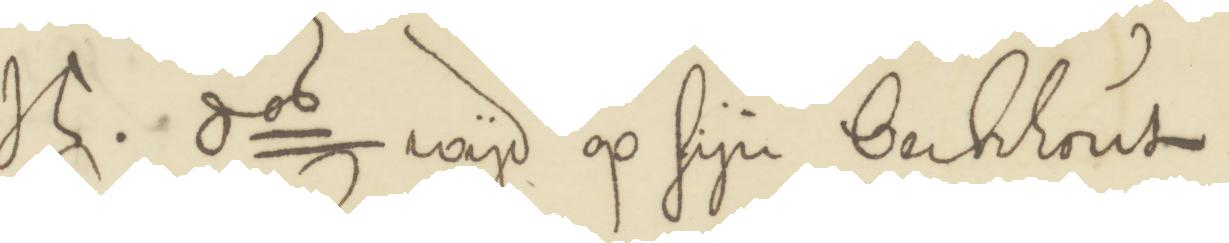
15. d=os wijd op sijn berkhout
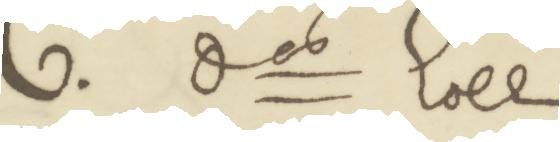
6. d=os holl
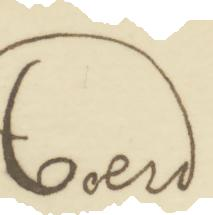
voerd
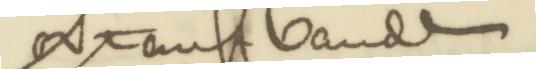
overcomst vande
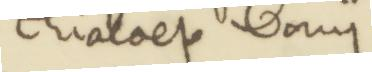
chialoep bonij
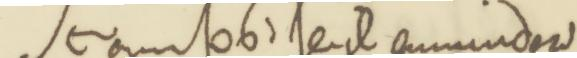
Scomps: seijl enmindere
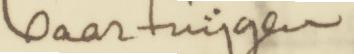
vaartuijgen
